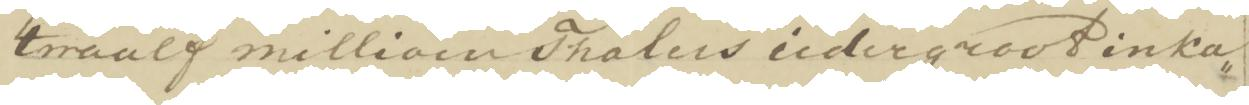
twaalf millioen Thalers ieder groot in ka„
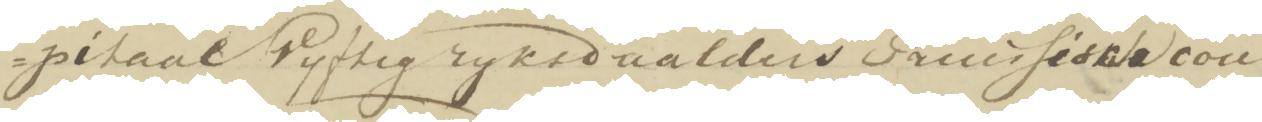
=pitaal Vyftig ryksdaalders Pruissische cou
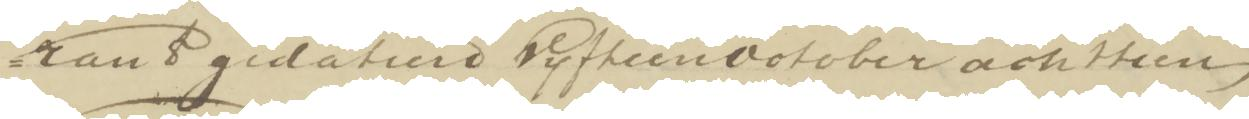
=rant gedateerd Vyftien October achttien
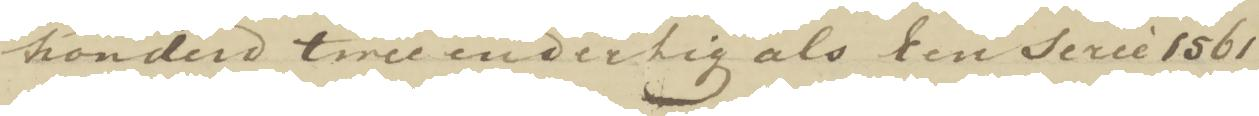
honderd twee en dertig als Een serie 1561
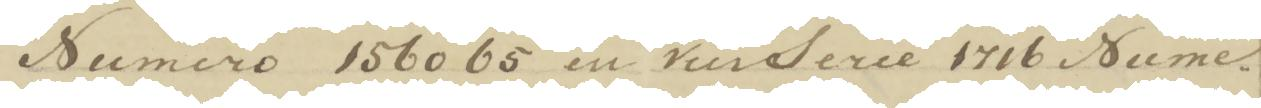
Numero 1560 65 en vier serie 1716 Nume„
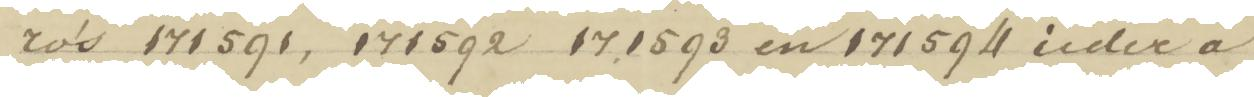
ros 171591, 171592, 171593 en 171594 ieder a
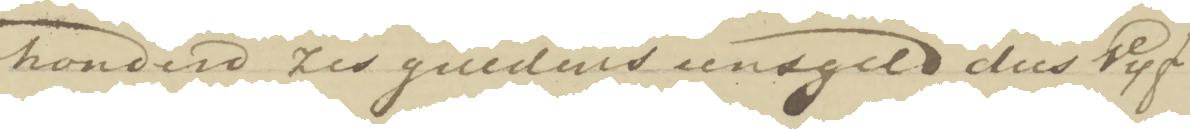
honderd zes guldens eens geld dus Vyf
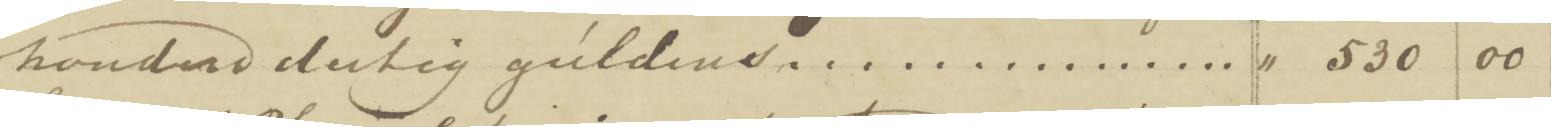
honderd dertig guldens. . . . . . . . . . . . . . . . „ 530 00
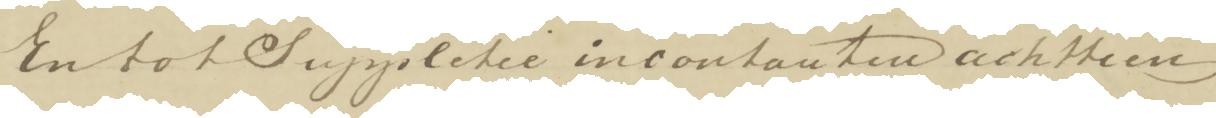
En tot Suppletie in contanten achttien,
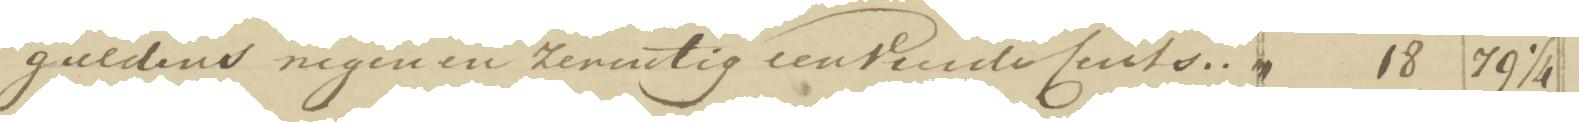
guldens negen en zeventig een vierde Cents . . „ 18 79 1/4
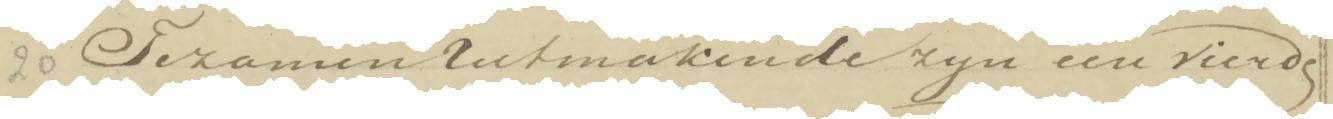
20 Tezamen uitmakende zyn een vierde
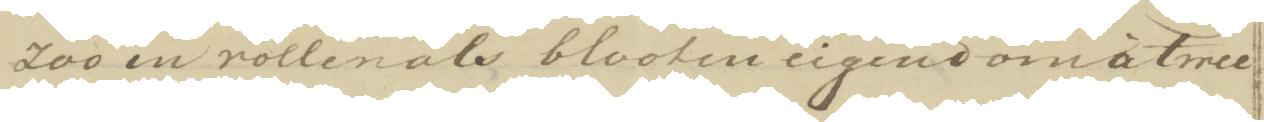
zoo in vollen als blooten eigendom à twee
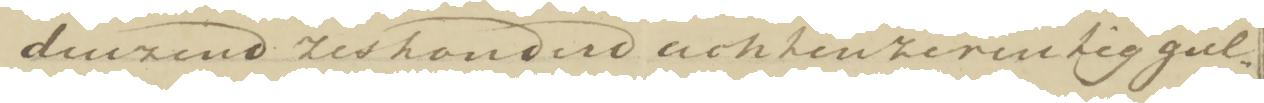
duizend zeshonderd acht en zeventig gul„
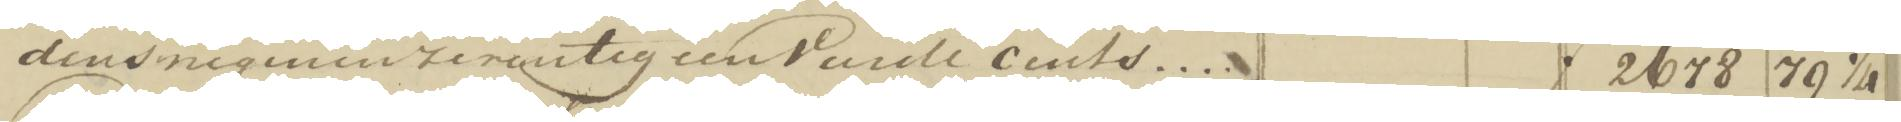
dens negen en zeventig een Vierde cents . . . . ƒ 2678 79¼
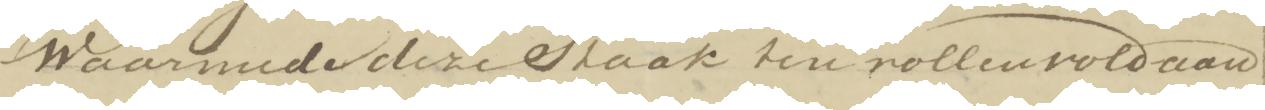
Waarmede deze Staak ten vollen voldaan
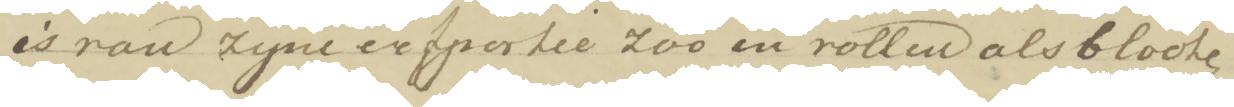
is van zyne erfportie zoo in vollen als blooten
